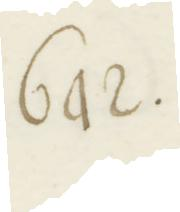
642.
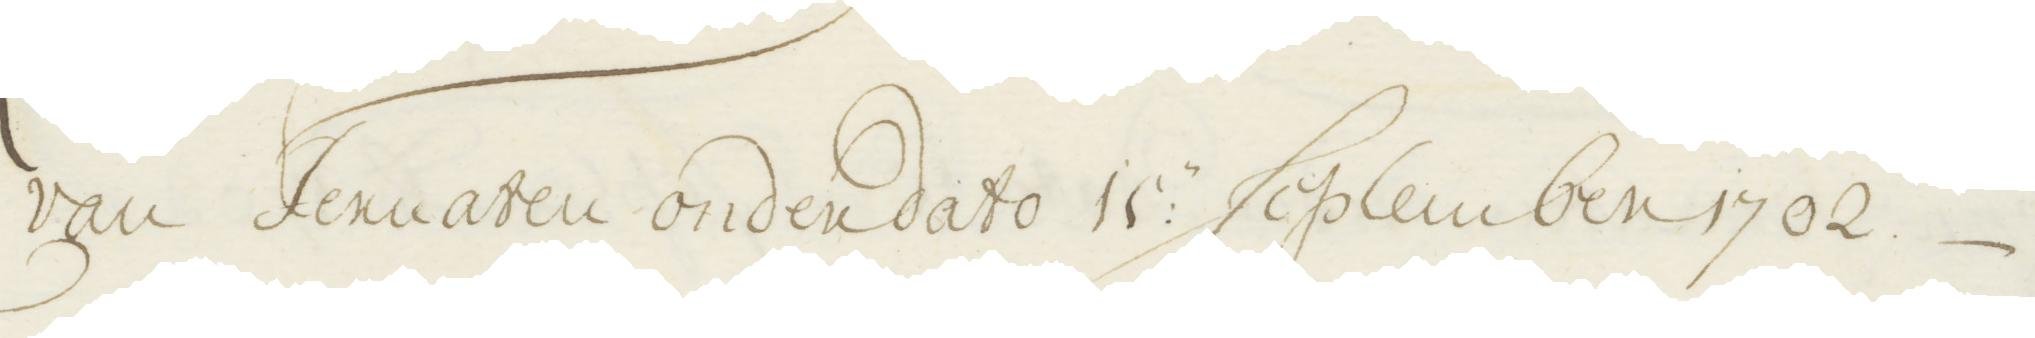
van Ternaten onder dato 15:en September 1702. —
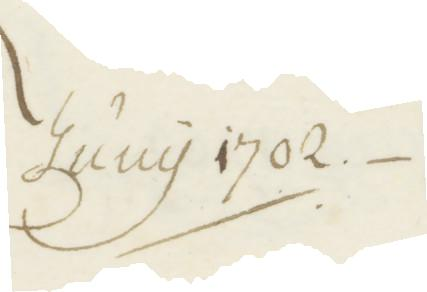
Iunij 1702. —
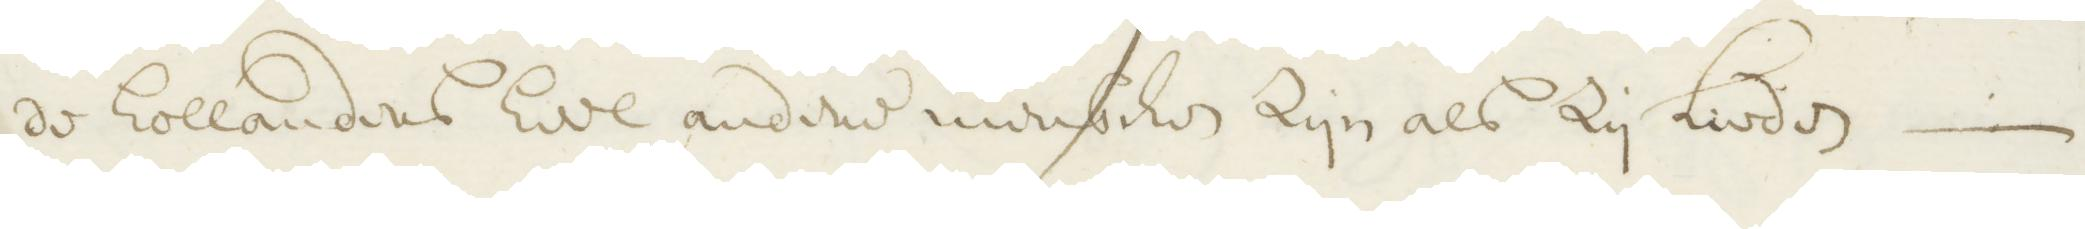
de hollanders heel andere menschen zijn als zij lieden —
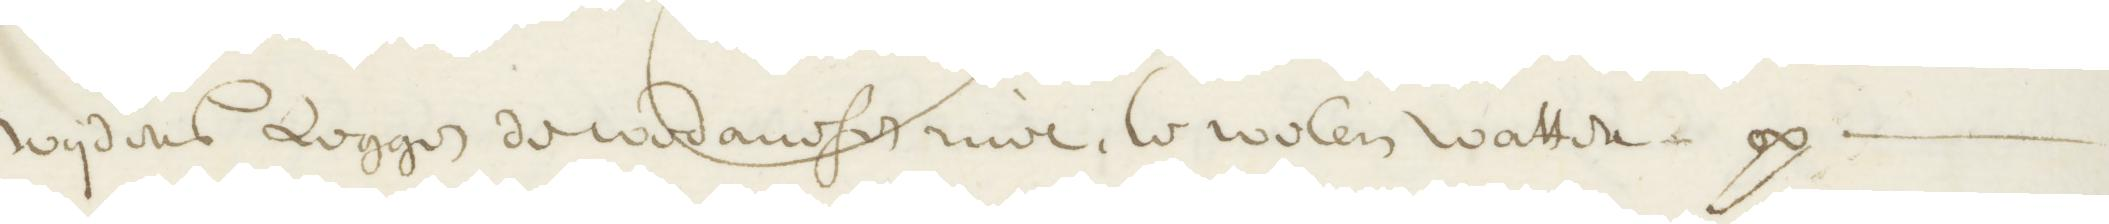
wijders zeggen de wedanesen niet, te weten watter op —
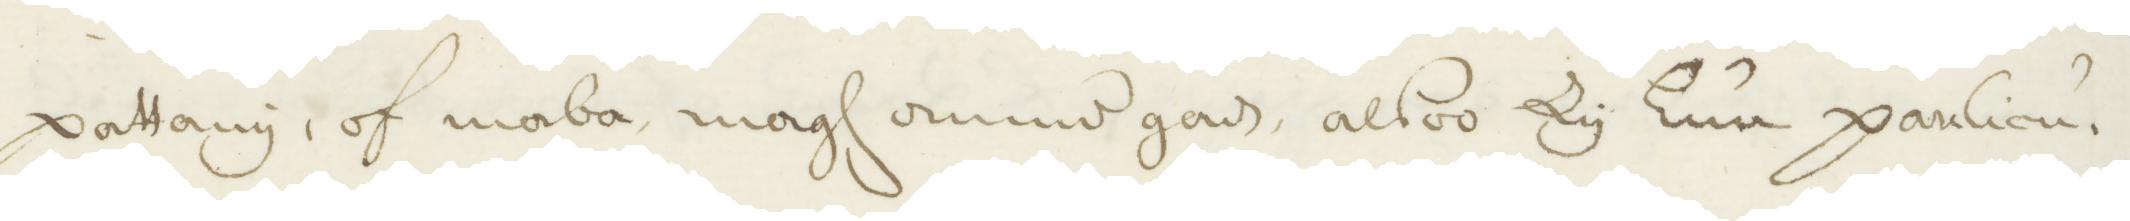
pattanij, of maba, magh omme gaen, alsoo zij hun particu,
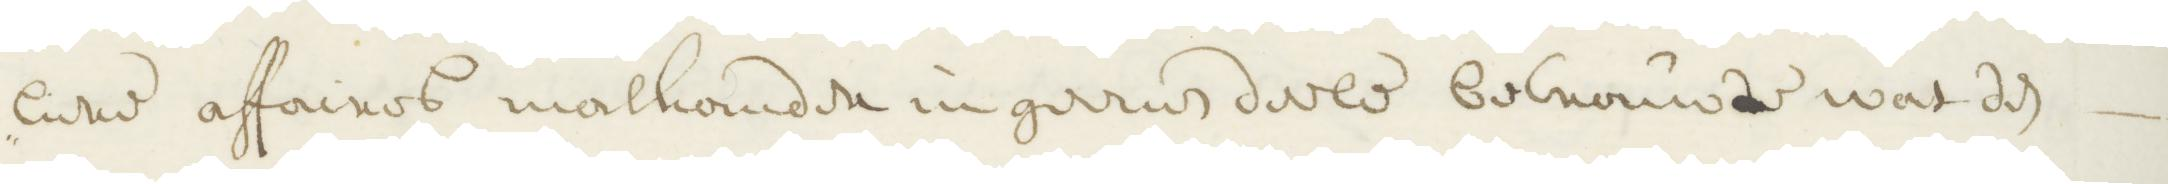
„liere affaires malkander in geenen deele betrouwde wat den —
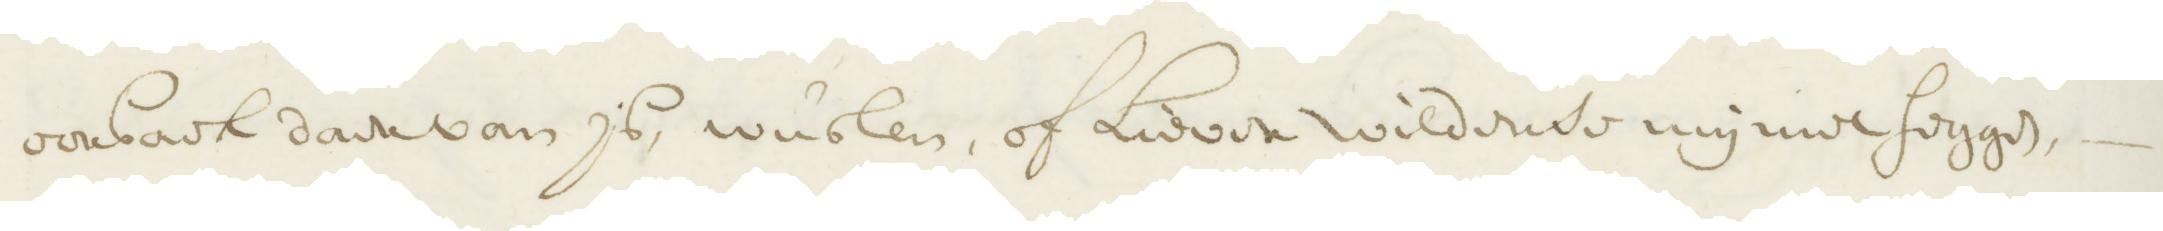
oorsaek daer van js, wusten, of Liever wildense mij niet seggen, —
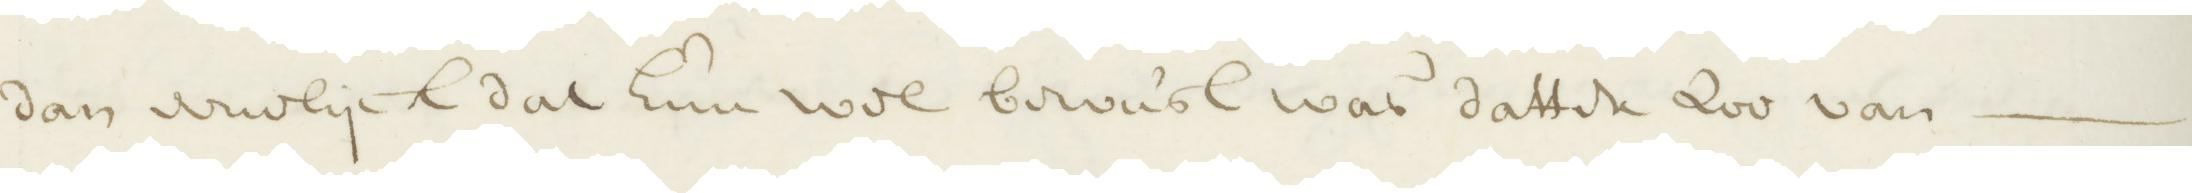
dan eenelijck dat hun wel bewust was datter zoo van —
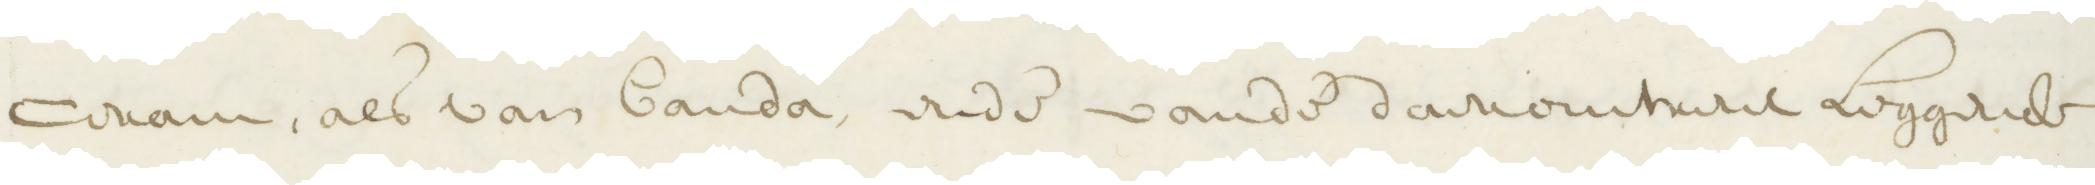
ceram, als van banda, ende vande daeromtrent leggende
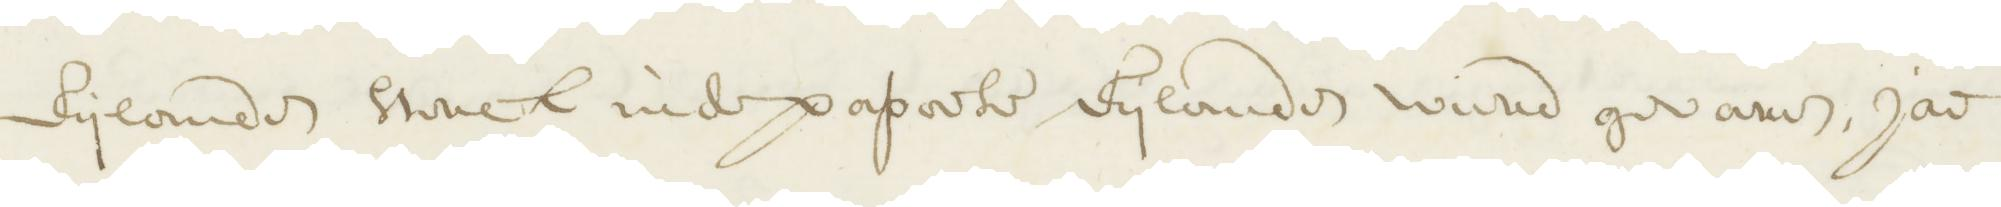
Eijlanden sterck inde papoese Eijlanden wierd gevaren, jae
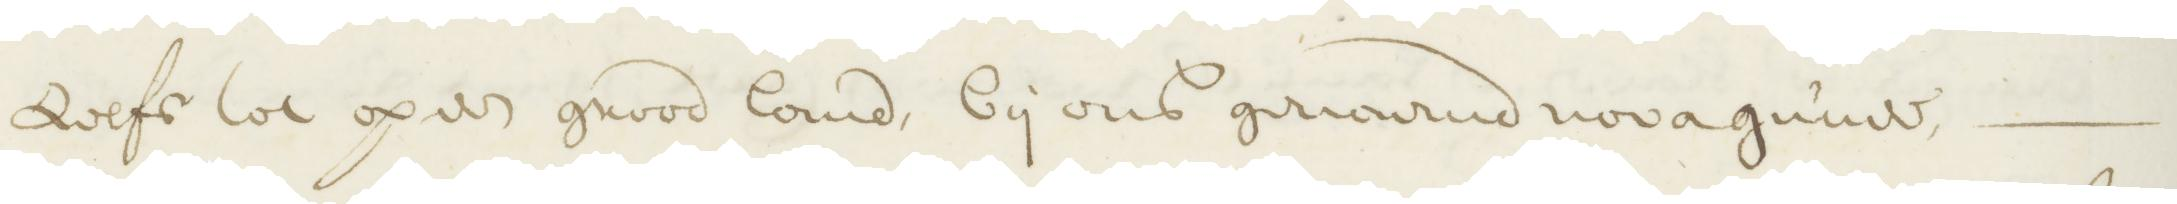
zelfs tot op een grood land, bij ons genaemd nova gunee, —
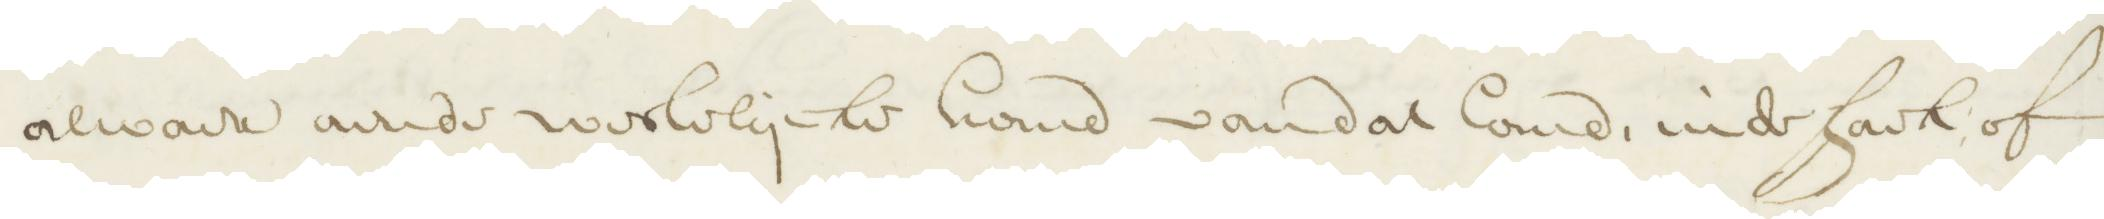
alwaer aende westelijcke kand van dat land, in de saek: of
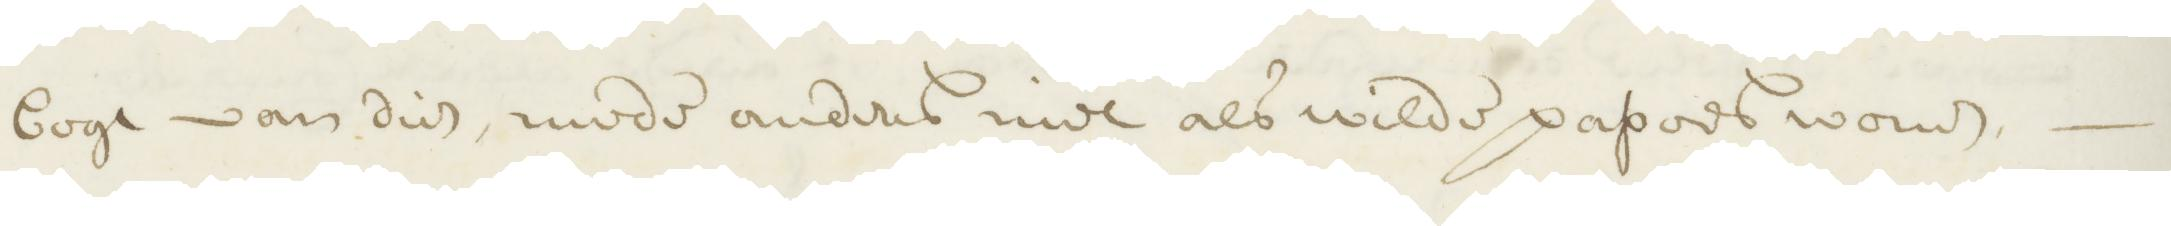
bogt van dien, mede anders niet als wilde papoes wonen, —
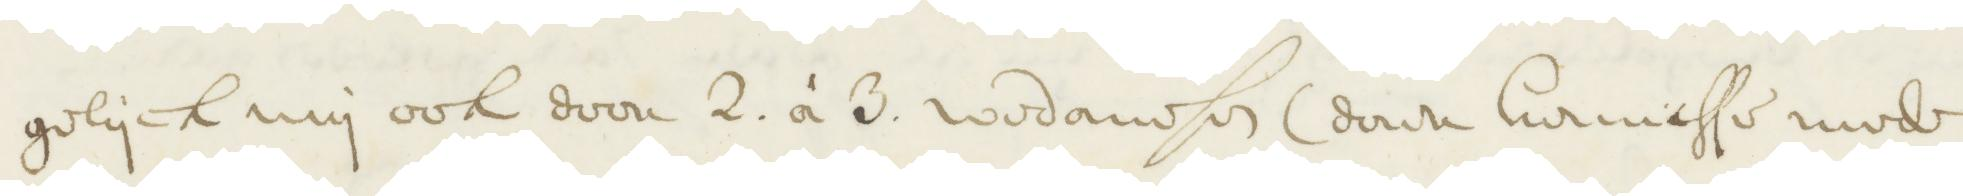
gelijck mij ook door 2. à 3. wedanesen (daer kennisse mede
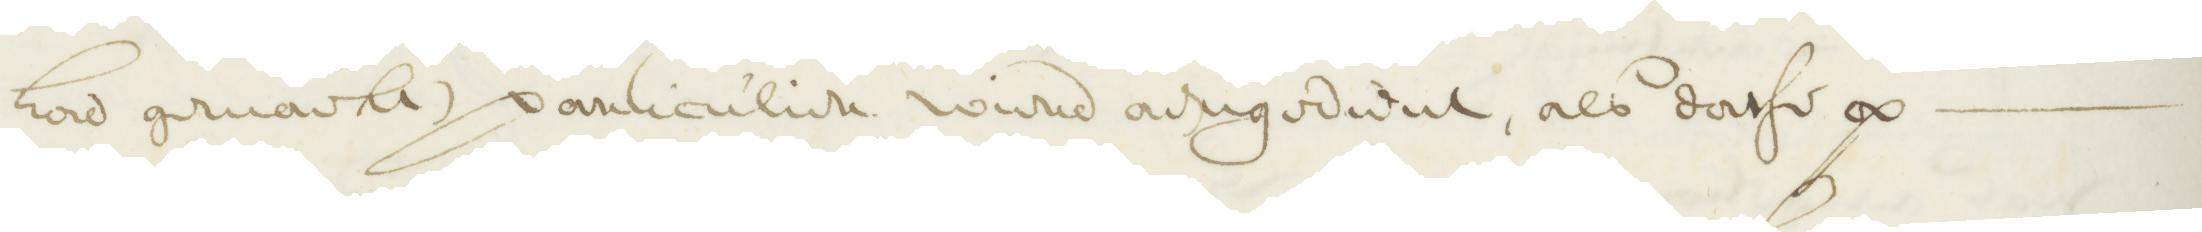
had gemaekt) particulier wierd aengedient, als datse op —
